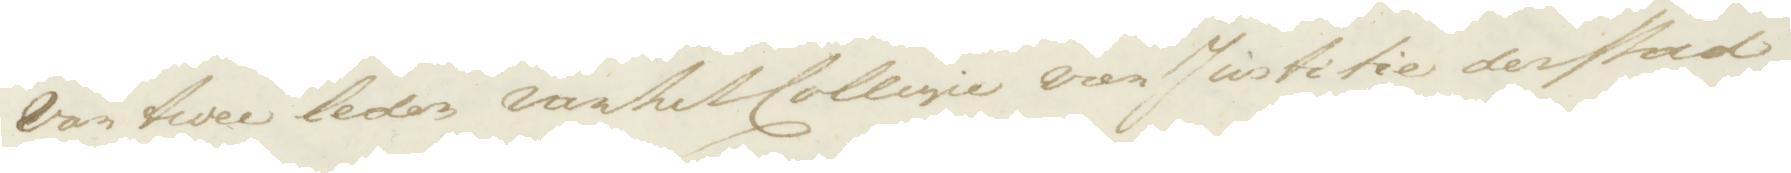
van twee leden van het Collegie van Justitie der stad
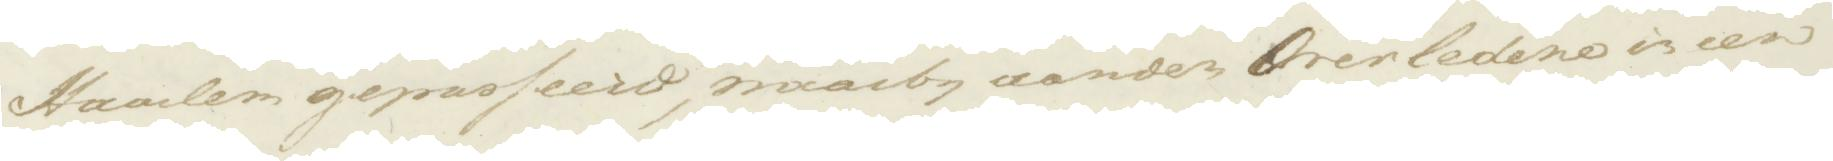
Haarlem gepasseerd, waarby aan den Overledene in een
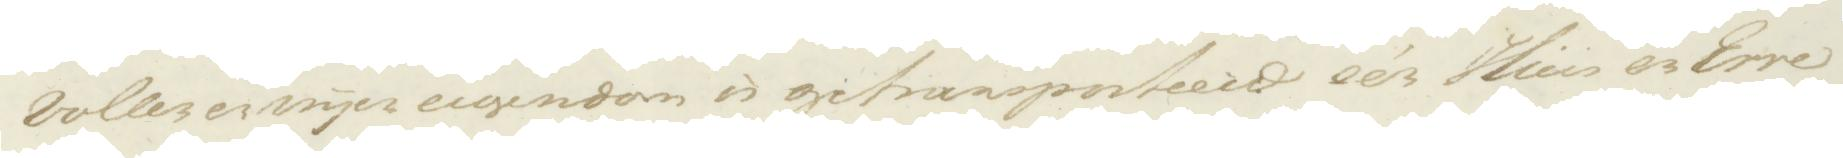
vollen en vrijer eigendom is getransposteerd een Huis en Erve
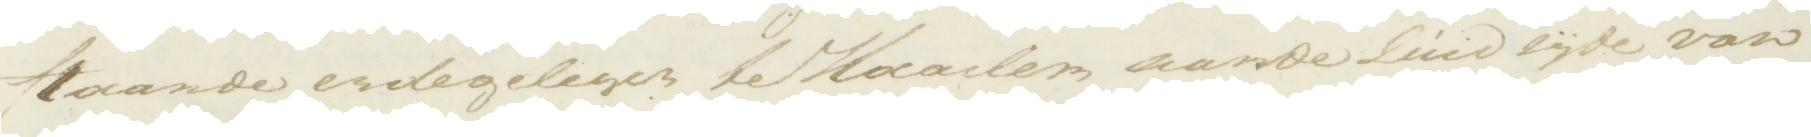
staande ende gelegen te Haarlem aande Zuid zijde van
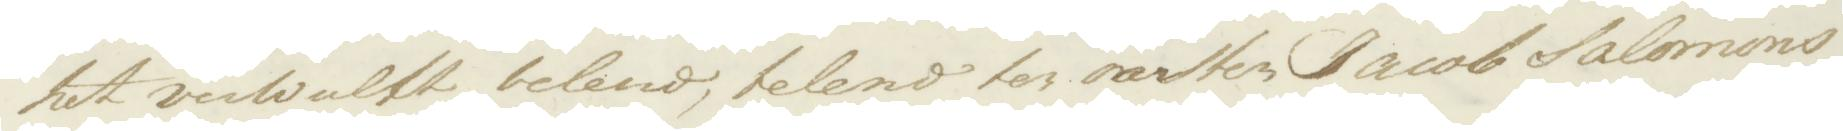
het verwulft, belend, telend ten oversten Jacob Salomons
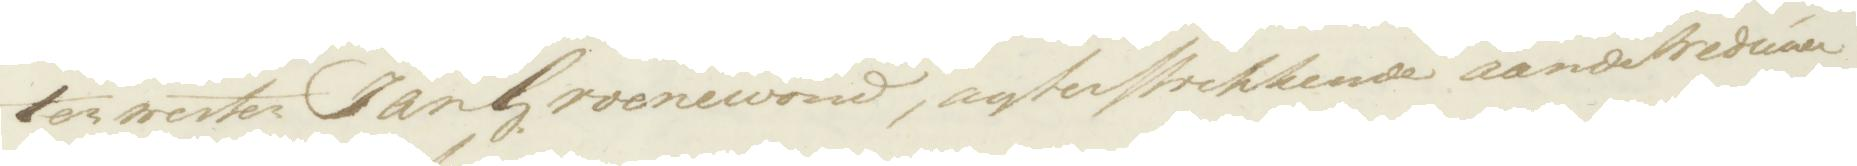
ten westen Jan Groenewoud, agterstrekkende aan de Weduwe
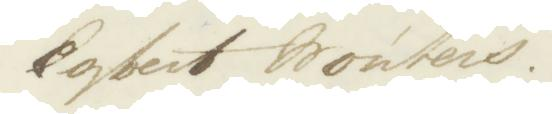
Egbert Wouters.
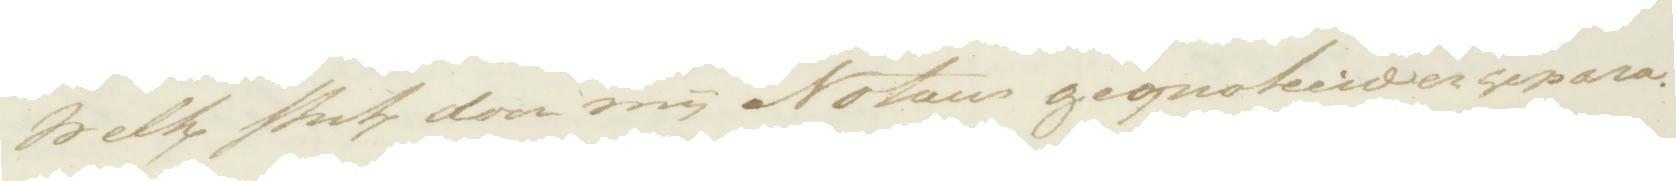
Welk stuk door mij Notaris gequoteerd en gepara
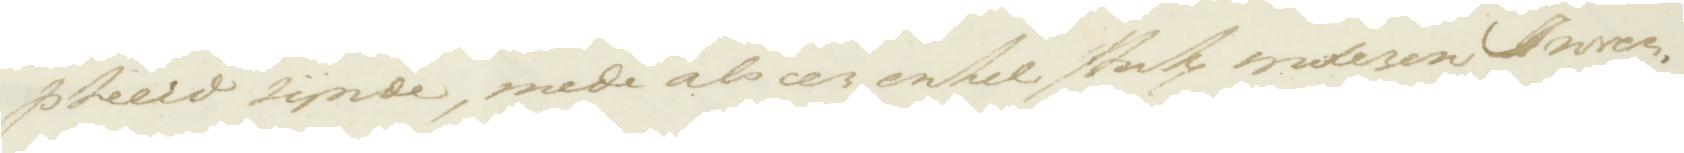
pheerd zijnde, mede als een enkel stuk in dezen Inven„
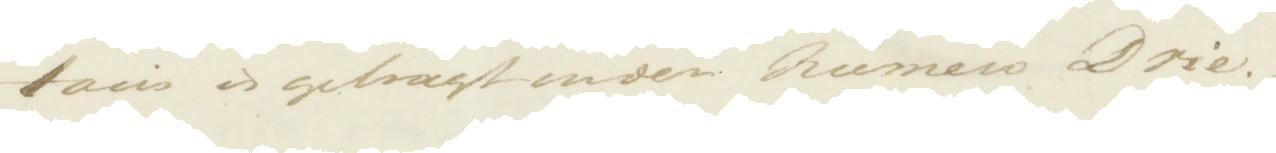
taris is gebragt onder Numero Drie.
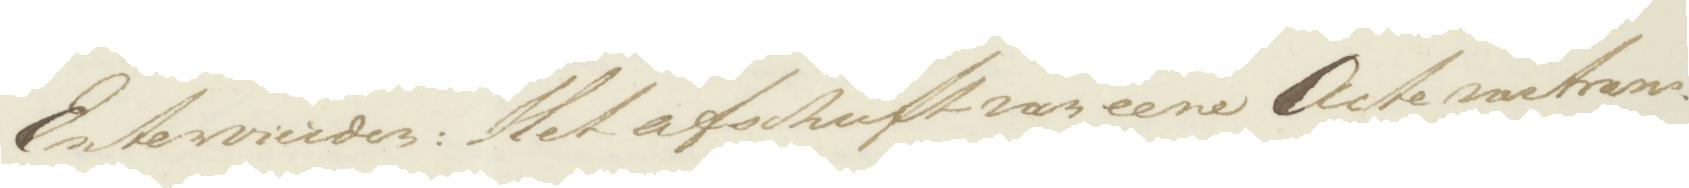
En ten vierden: Het afschrift van eene Acte van trans
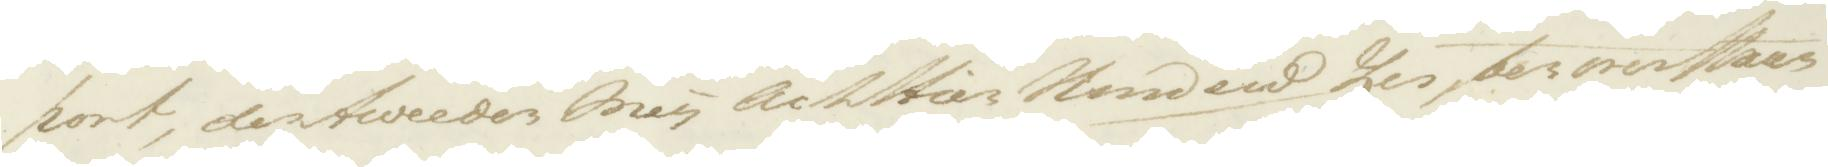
port, den tweeden meij Achttien Honderd Zes, ten overstaan
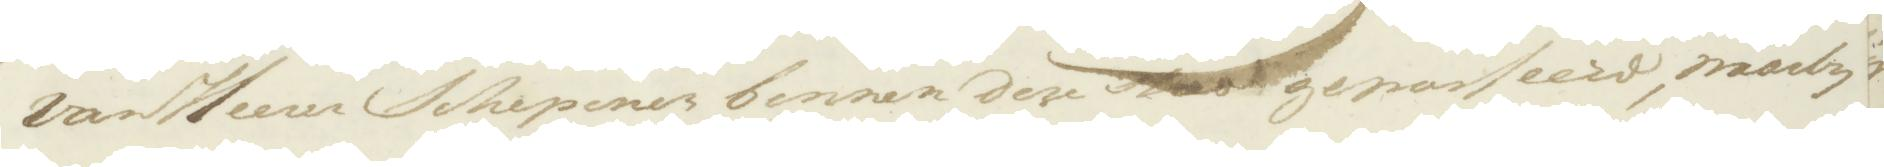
van Heeren Schepenen binnen deze Stad gepasseerd, waarby
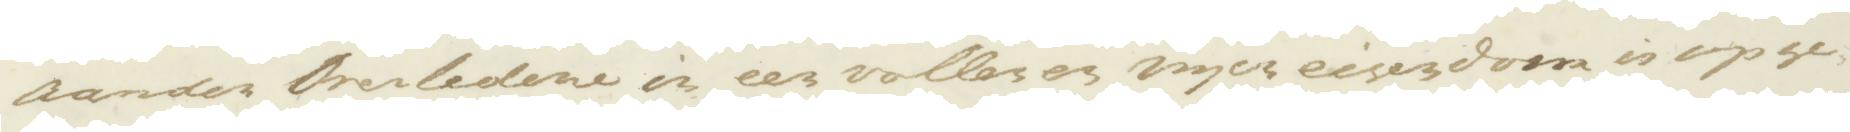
aan den overledene in een vollen en vryen eigendom is opge
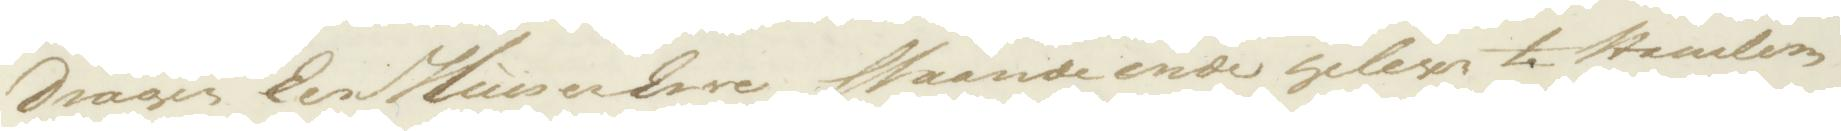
dragen Een Huis en Erve staande ende gelegen te Haarlem
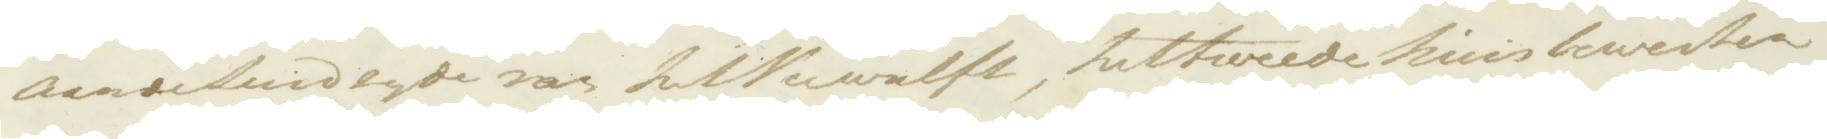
aan de Zuidzyde van het Verwulft, het tweede huis bewesten
